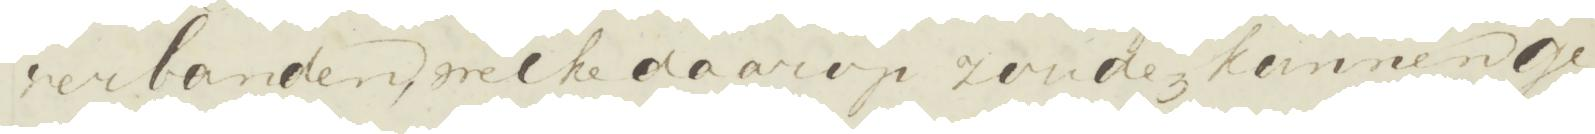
verbanden, welke daarop zouden kunnen ge,
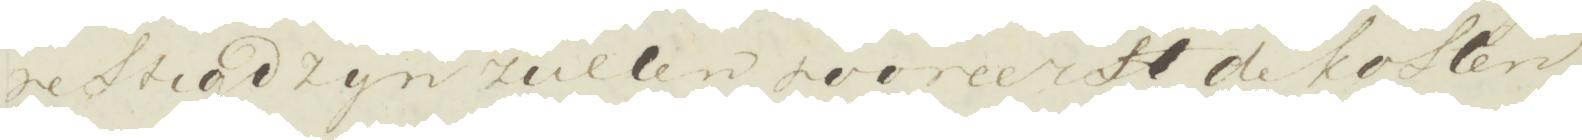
vestigd zyn zullen vooreerst de kosten
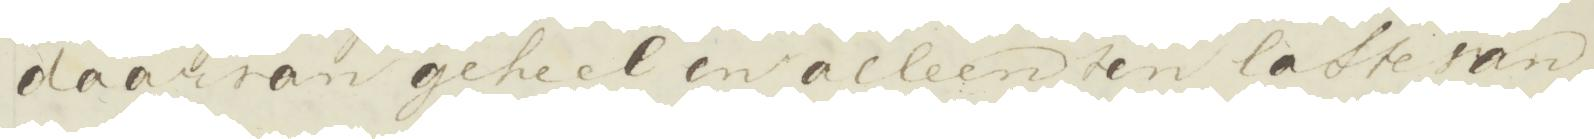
daarvan geheel en alleen ten laste van
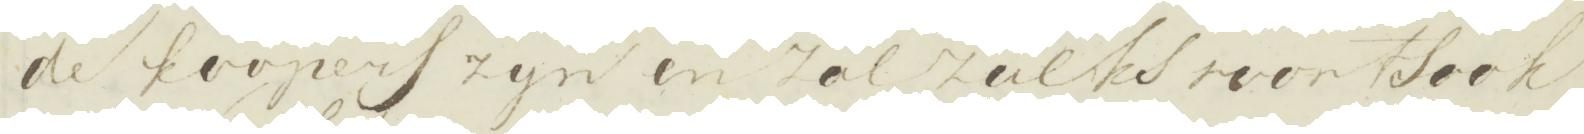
de koopers zyn en zal zulks voorts ook
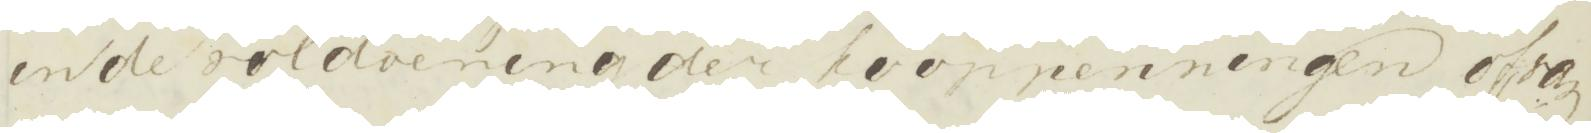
in de voldoening der kooppenningen of van
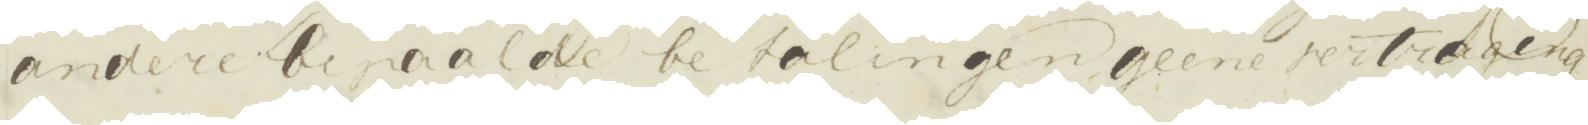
andere bepaalde betalingen geene vertraging
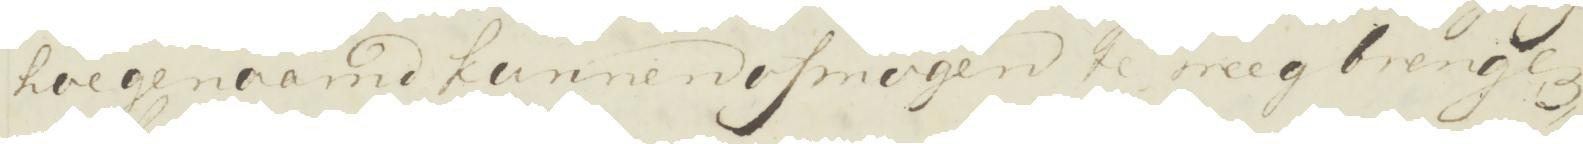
hoegenaamd kunnen of mogen te weeg brengen
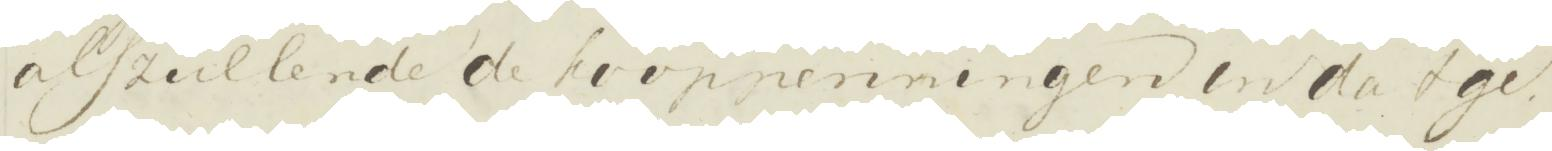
als zullende de kooppenningen in dat ge„
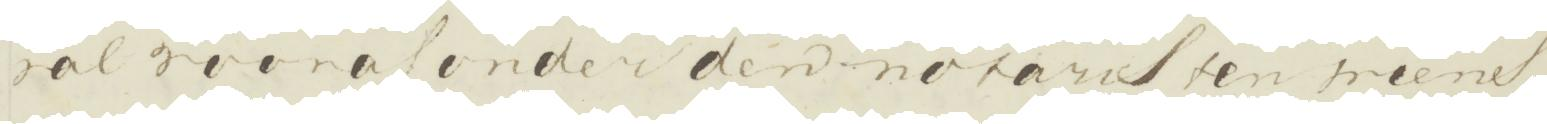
val vooraf onder den notaris ten wiens
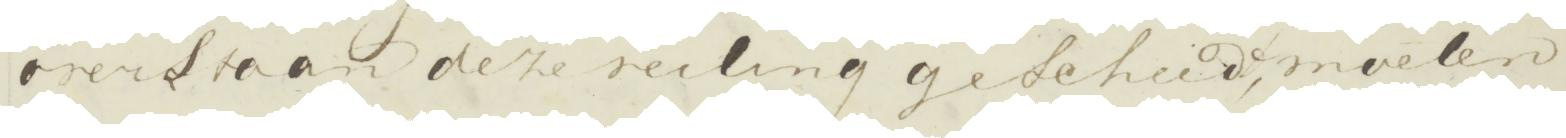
overstaan deze veiling geschiedt, moeten
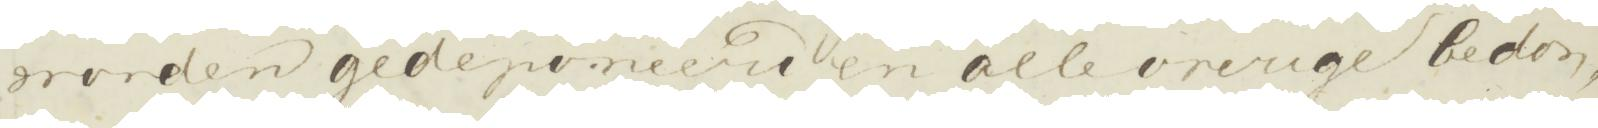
worden gedeponeerd en alle overige bedon„
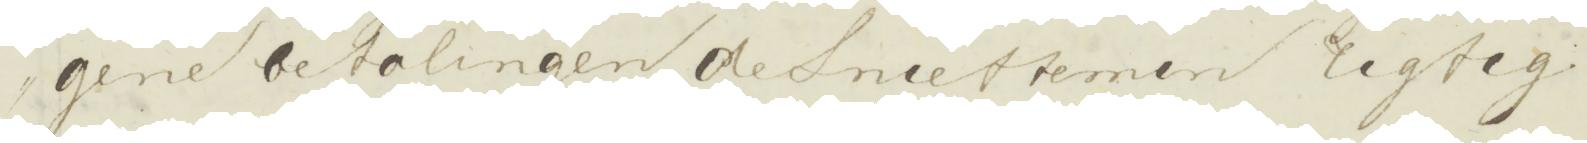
„gene betalingen des niettemin regtig
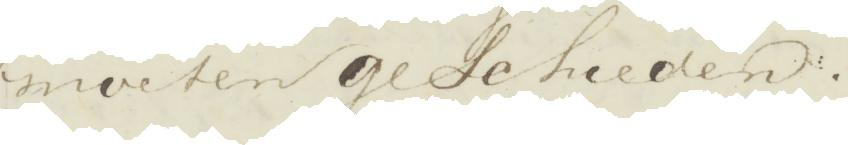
moeten geschieden.
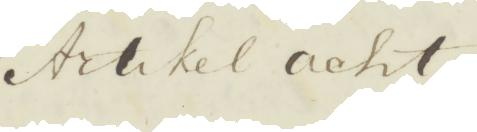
Artikel acht
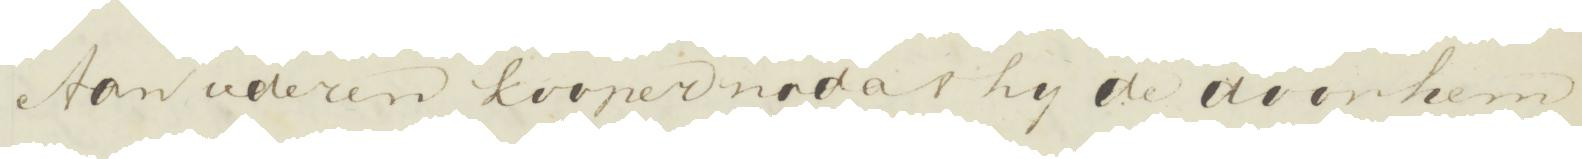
Aan iederen kooper nadat hy de door hem
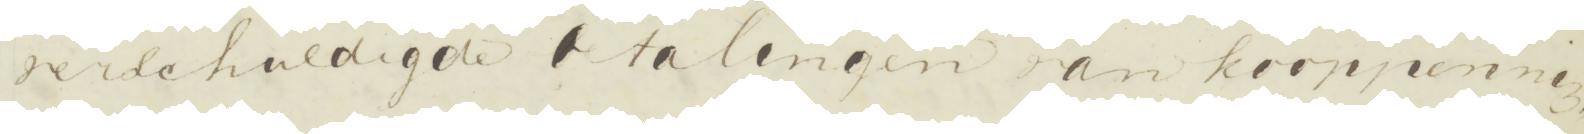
verschuldigde betalingen van kooppennig
